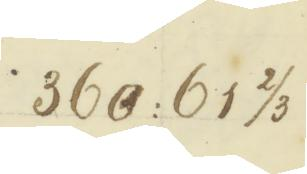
360:61 2/3
